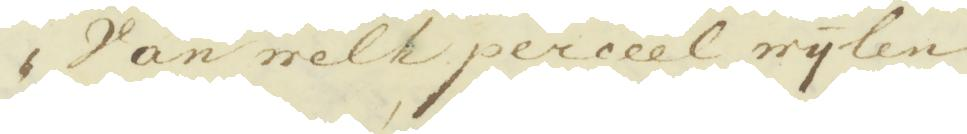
„ Van welk perceel wijlen
